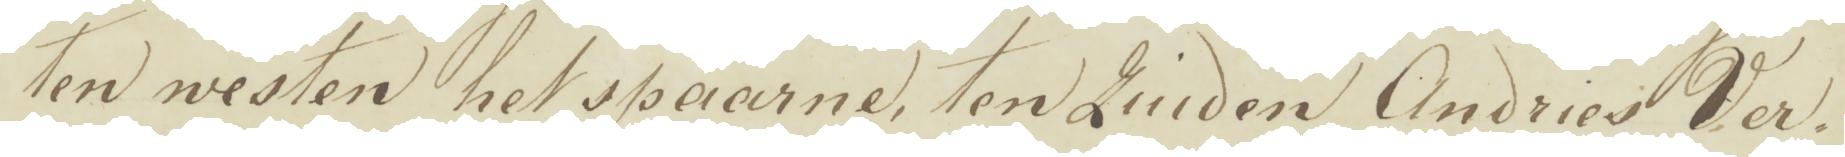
ten westen het spaarne, ten Zuiden Andries Ver„
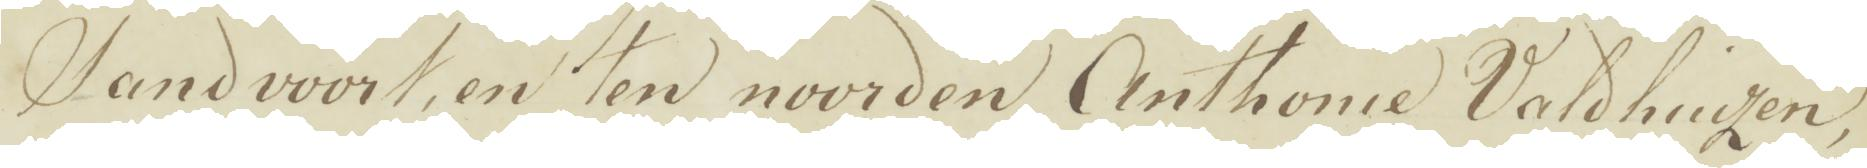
Sandvoort, en ten noorden Anthonie Valdhuizen,
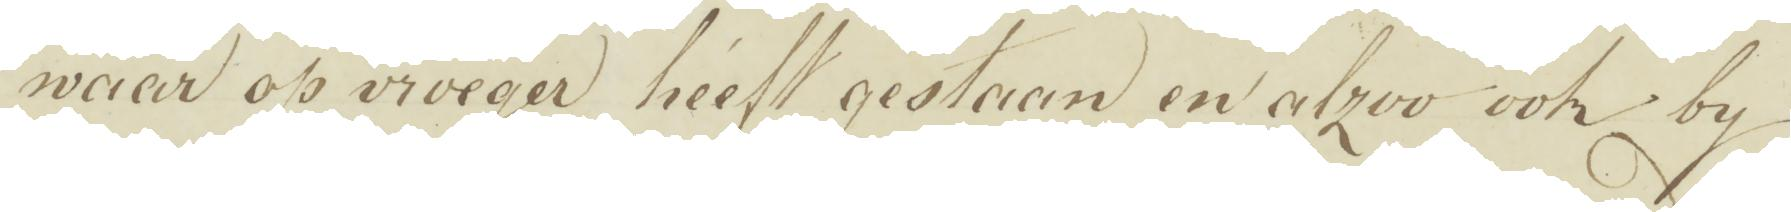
waar op vroeger heeft gestaan en alzoo ook by
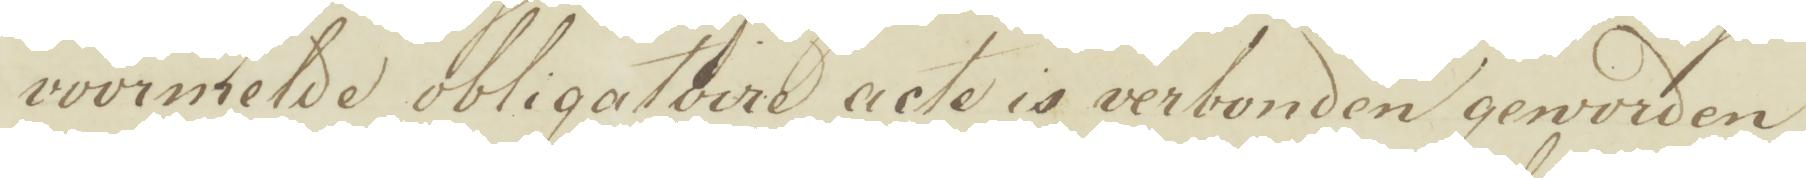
voormelde obligatoire acte is verbonden geworden
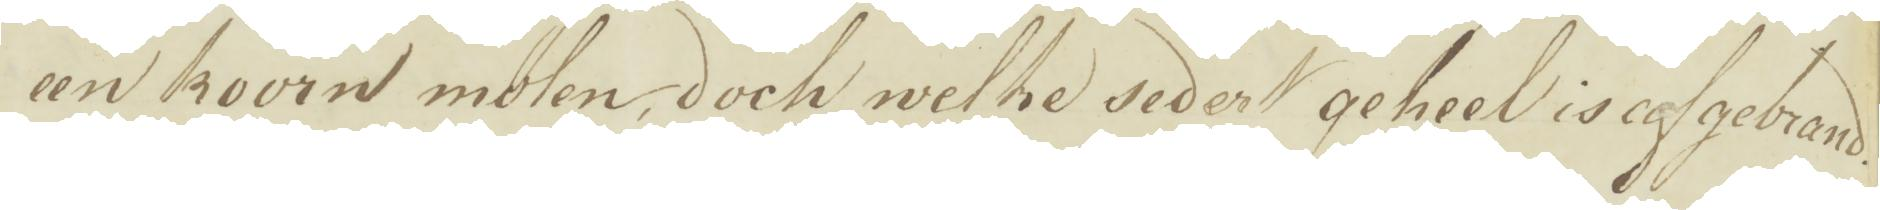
een hoorn molen, doch welke sedert geheel is afgebrand.
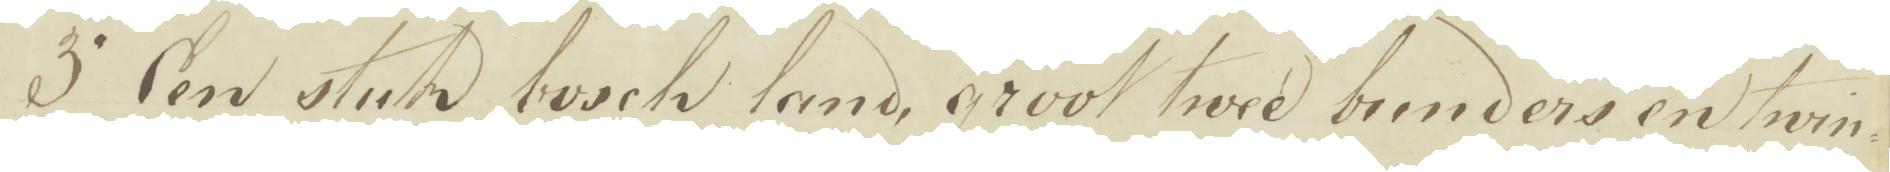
3' Een stuck bosch land, groot twee bunders en twin„
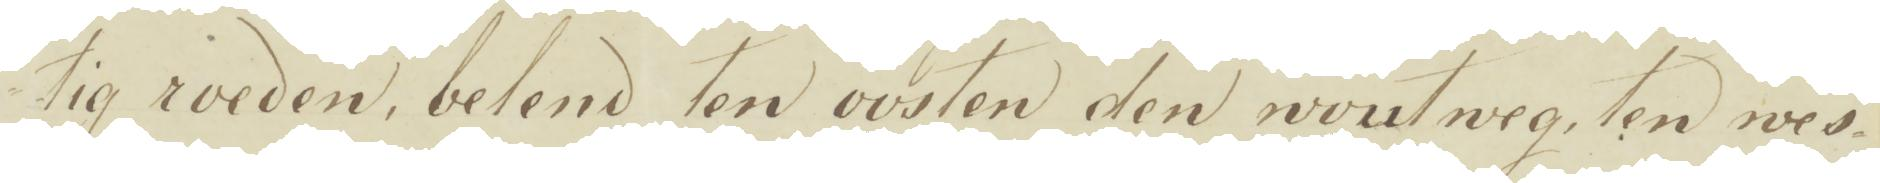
„tig roeden, belend ten oosten den woutweg, ten wes„
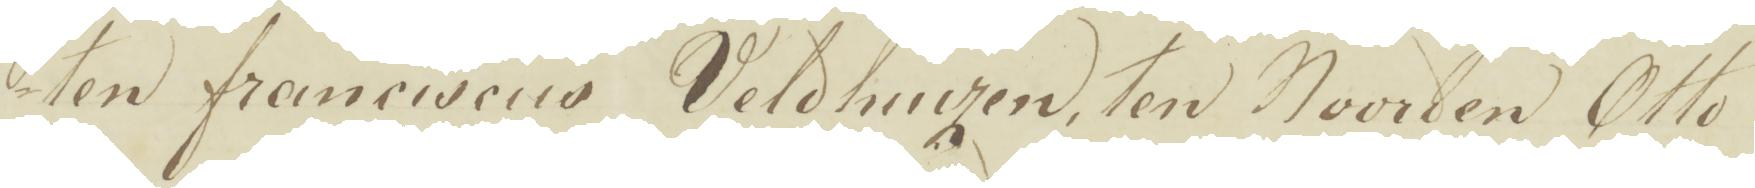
„ten franciscus Veldhuizen, ten Noorden Otto
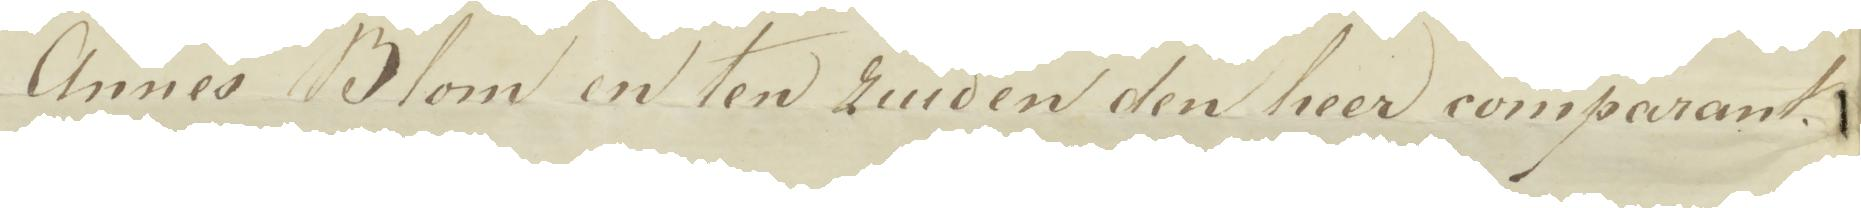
Annes Blom en ten zuiden den heer comparant.
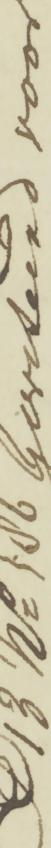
D13 N=o 586 geviseerd voor
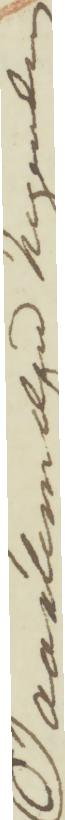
Haarlem den negenden
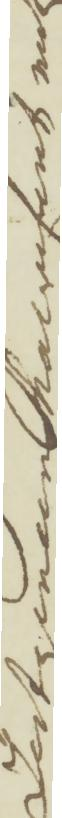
Zestig en een halve Cents met
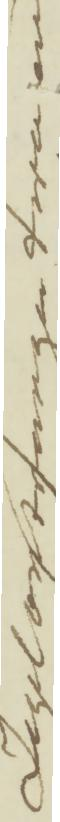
Zegel ontvangen twee en
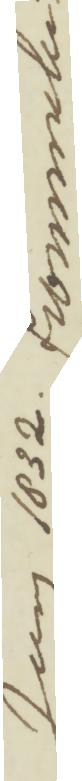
Juny 1832 Crommelin
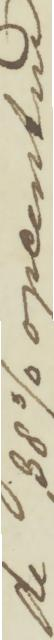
de 38% opcenten
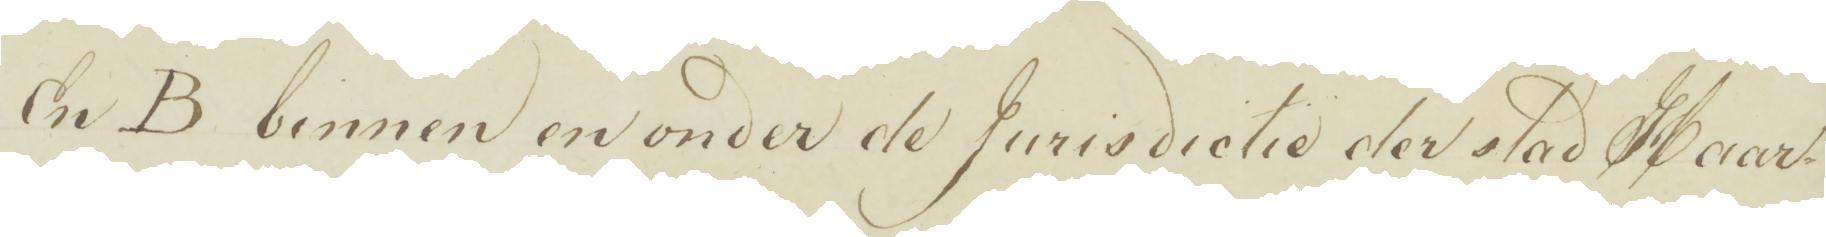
En B binnen en onder de Jurisdictie der stad Haar„
